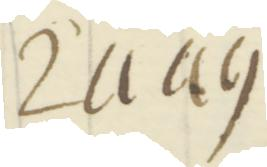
2449
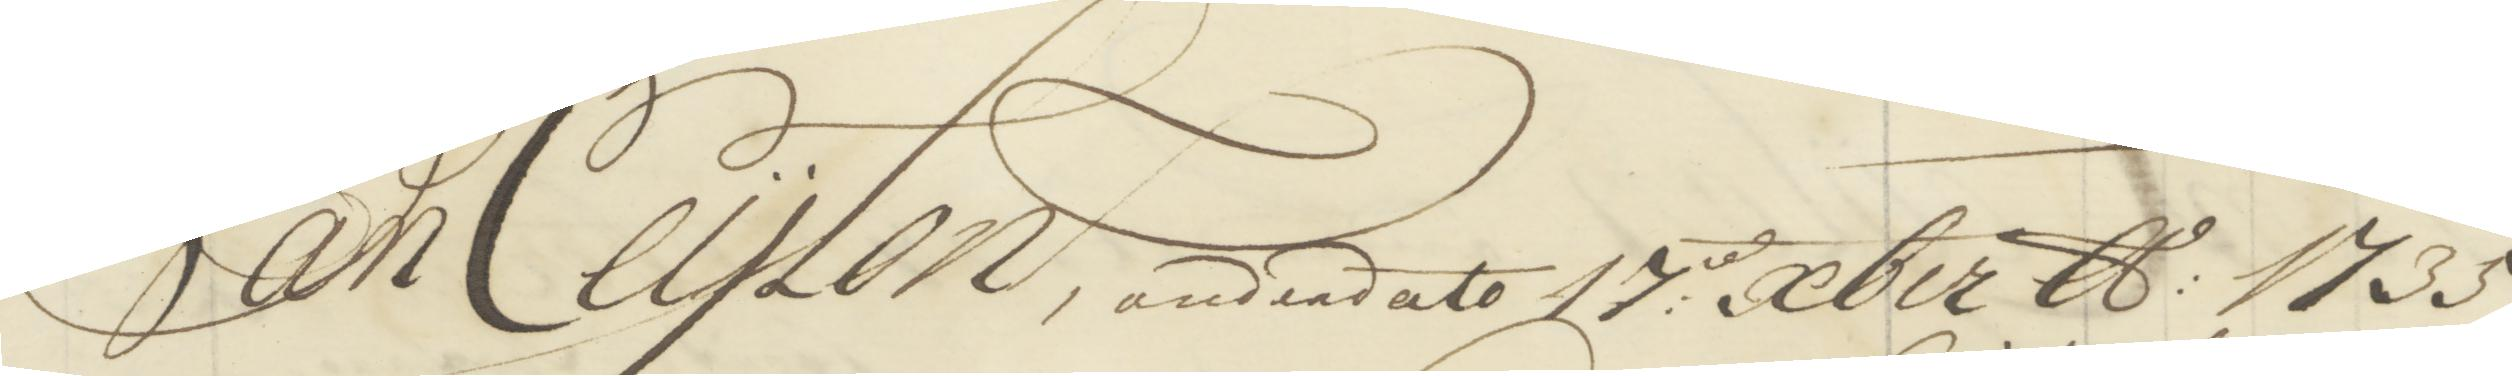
Van Ceijlon, onder dato 17:e xber A:o 1735
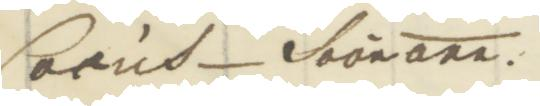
Cocus - Soor arr:
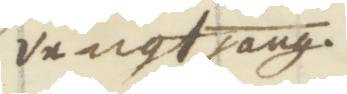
Vrugtjang.
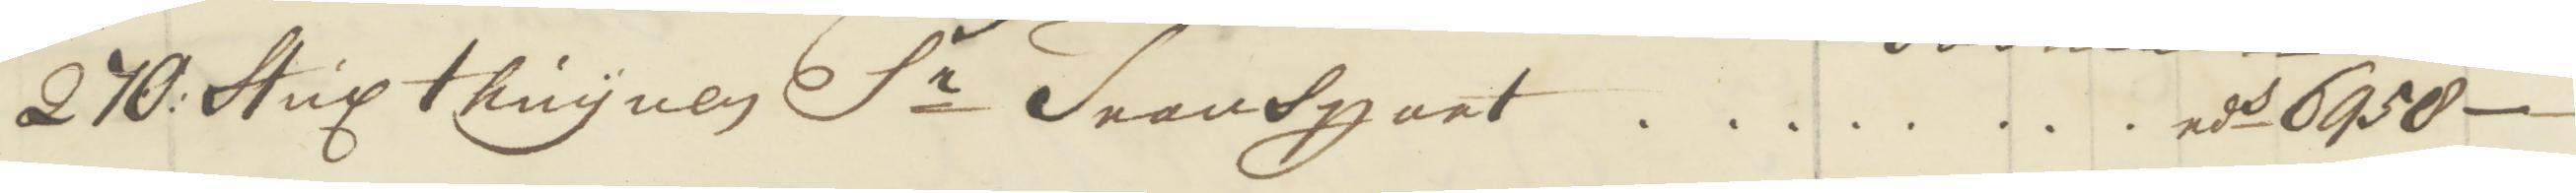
270: Stux thuijnen P=r Transport . . . . . . . . rd=s 6958 —
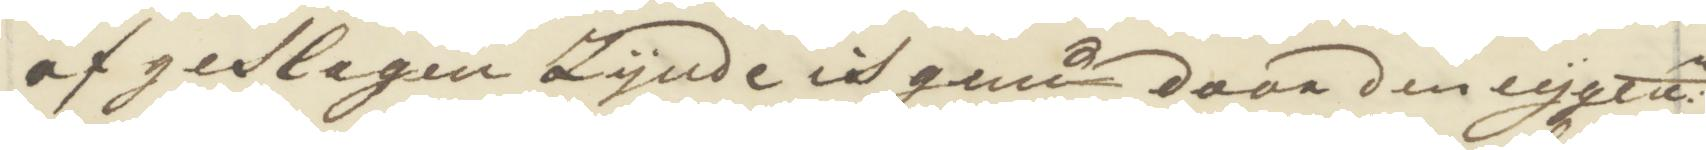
afgeslagen Zijnde is gem=e door den eijgen:m
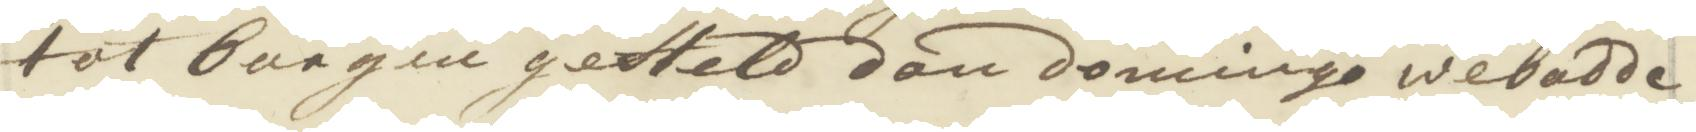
tot borgen gesteld don domingo webadde
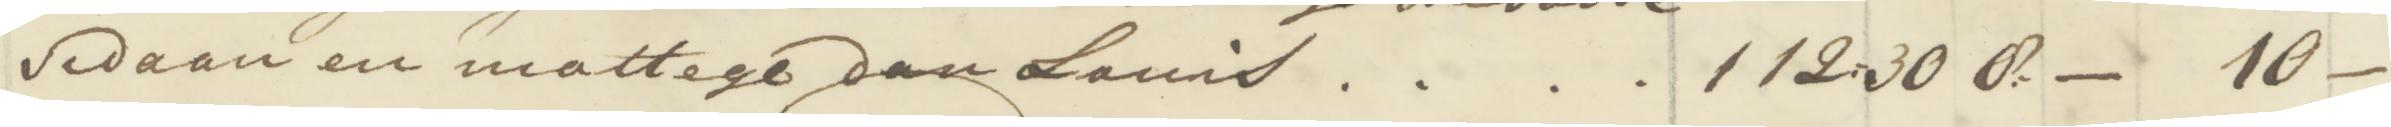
vedaan en mattege don Louis . . . . 112: 30 8: — 10 —
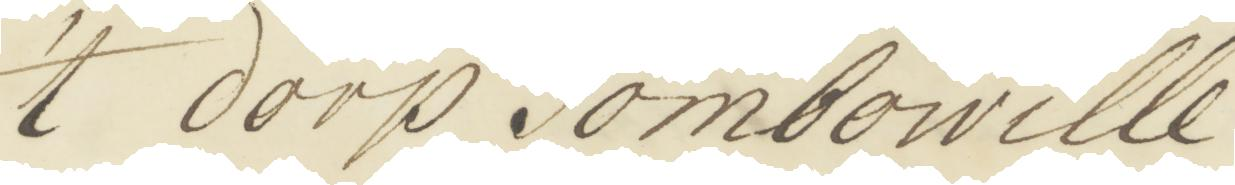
’t dorp Tombowille
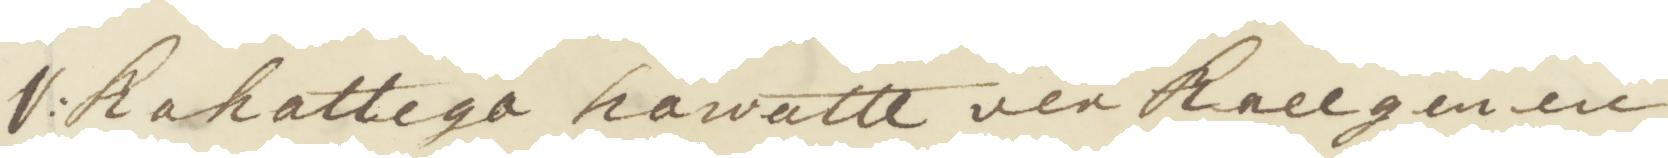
1: Kahattega hawatte verkreegen en
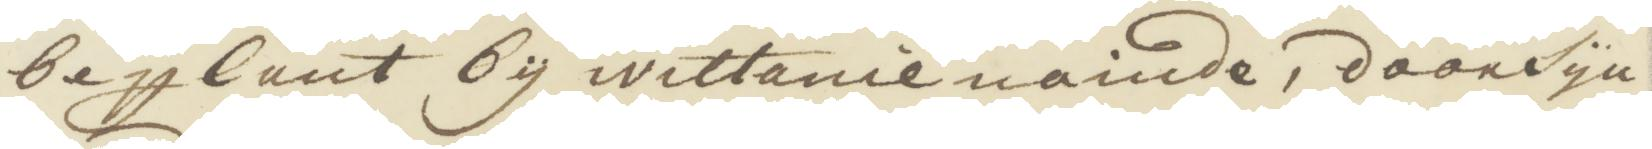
beplant bij wittanie nainde, door Sijn
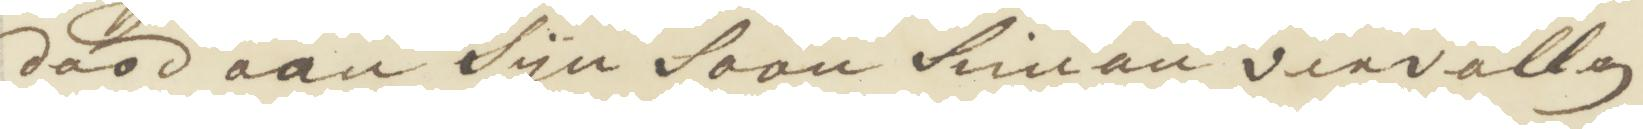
dood aan Sijn Soon Siman vervallen
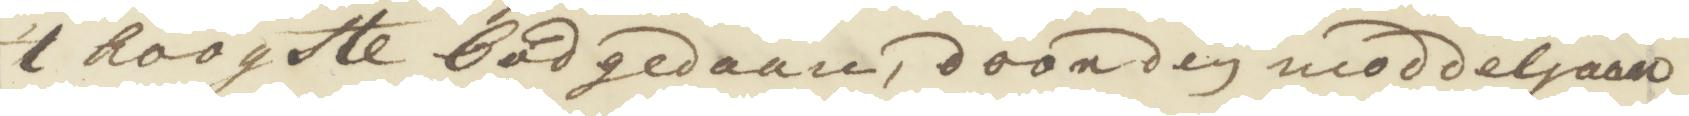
’t hoogste bod gedaan, door den moddeljaar
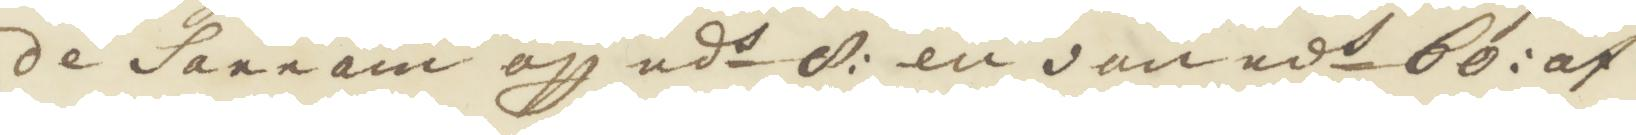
de Sarram op rd=s 8: en van rd=s 60: af
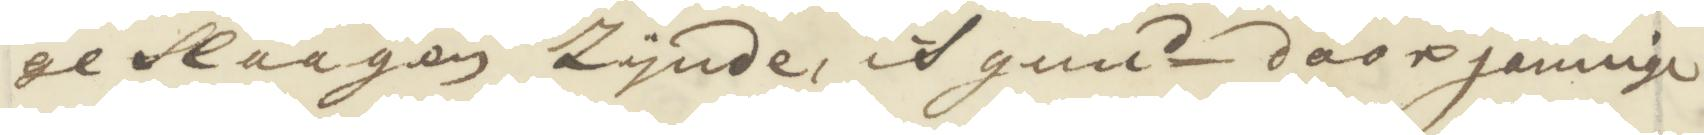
geslaagen Zijnde, is gun=d door jannige
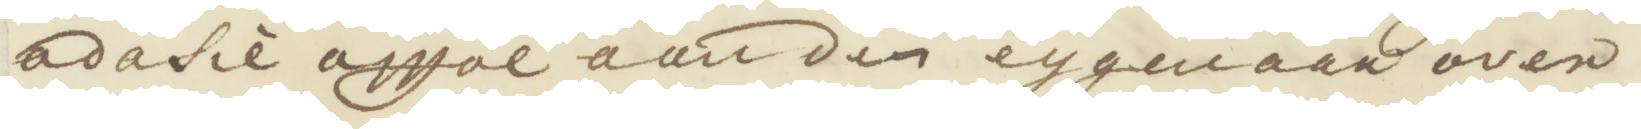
adasie appol aan den eygenaar over
